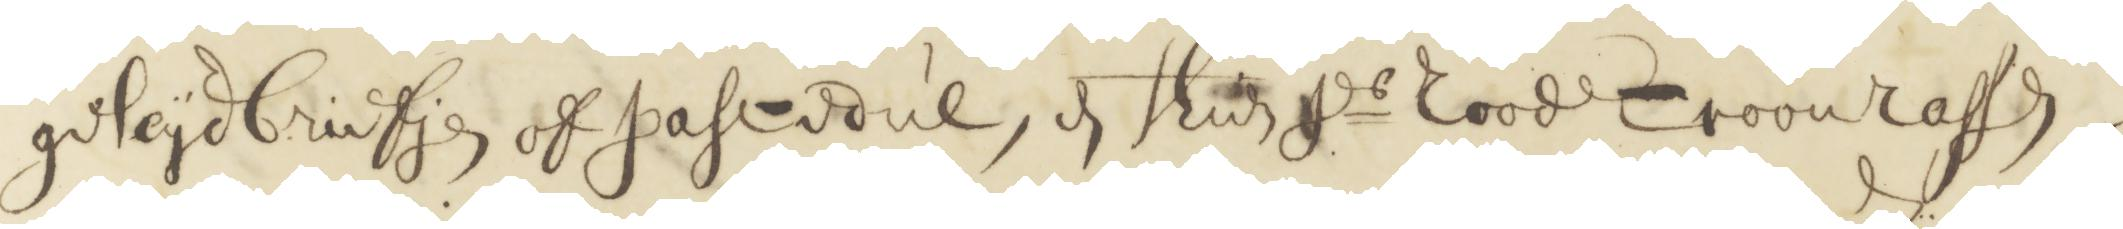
geleijd briefjen of pascedul, en thien p=s roode croonrassen
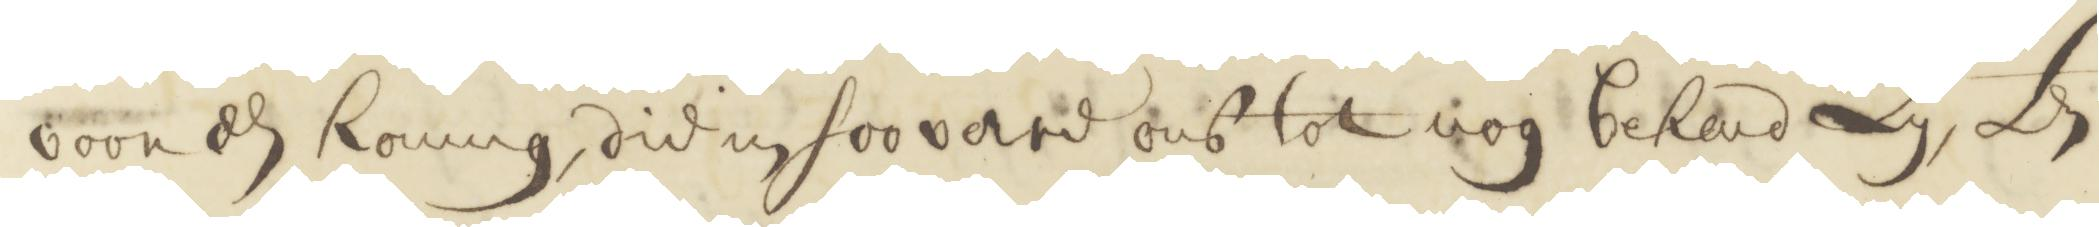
voor den koning, die in soo verre ons tot nog bekend zij, ten
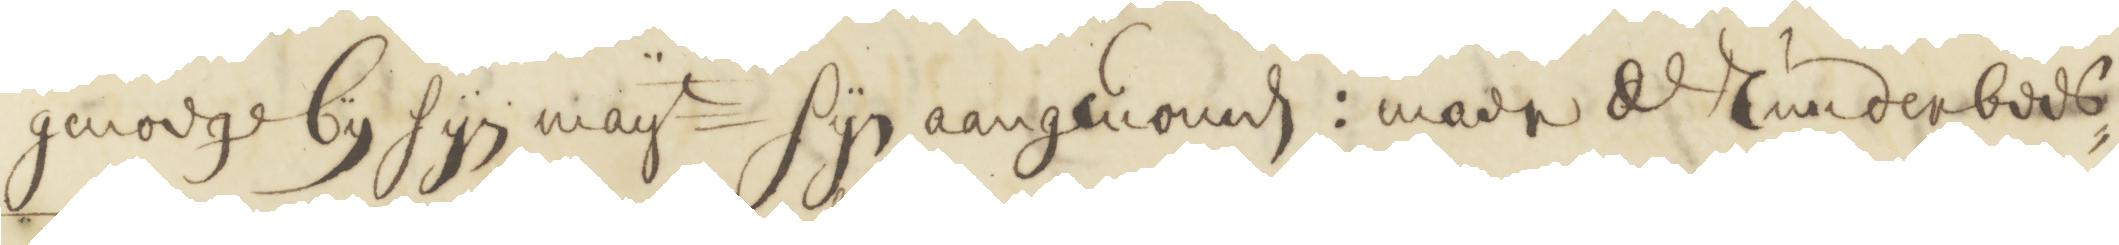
genoege bij sijn maij=t sijn aangenomen: maer de runderbees„
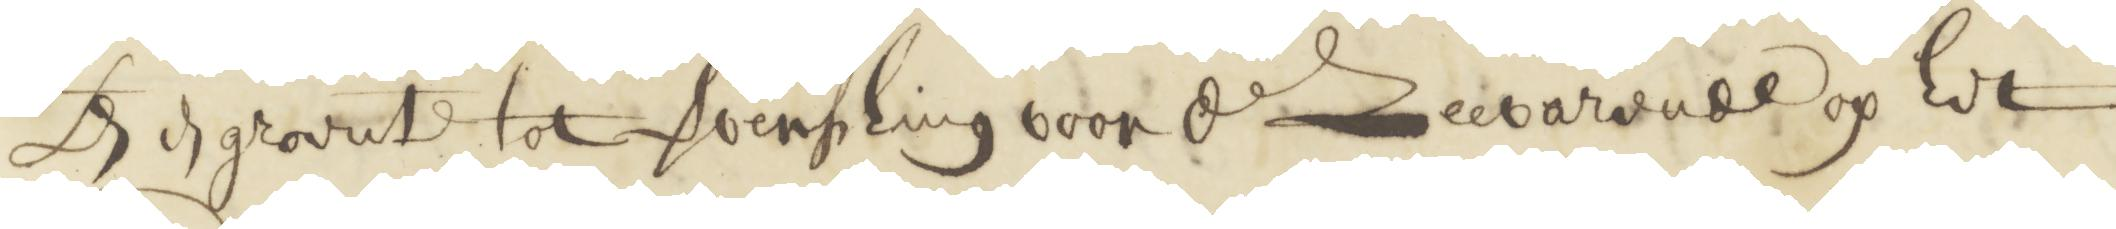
ten en groente tot verversching voor de zeevarende op het
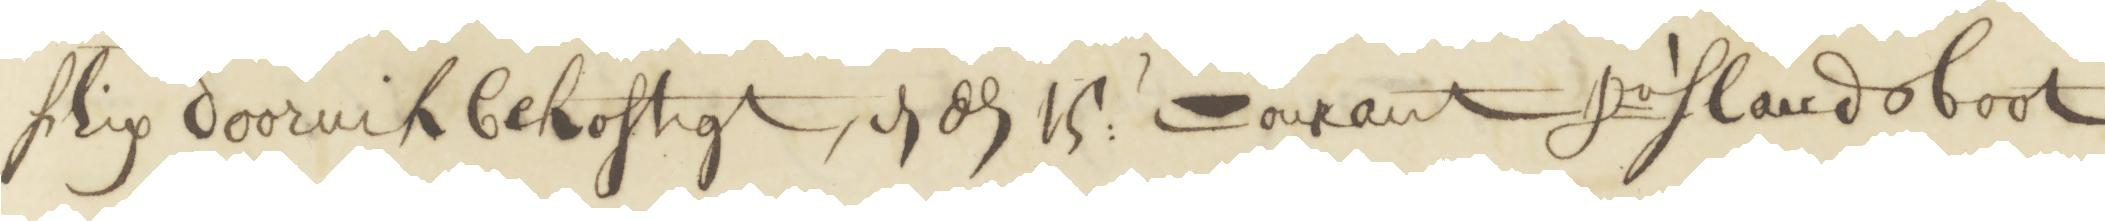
schip doornik bekostigt, en den 15:' courant p=r ’slandsboot
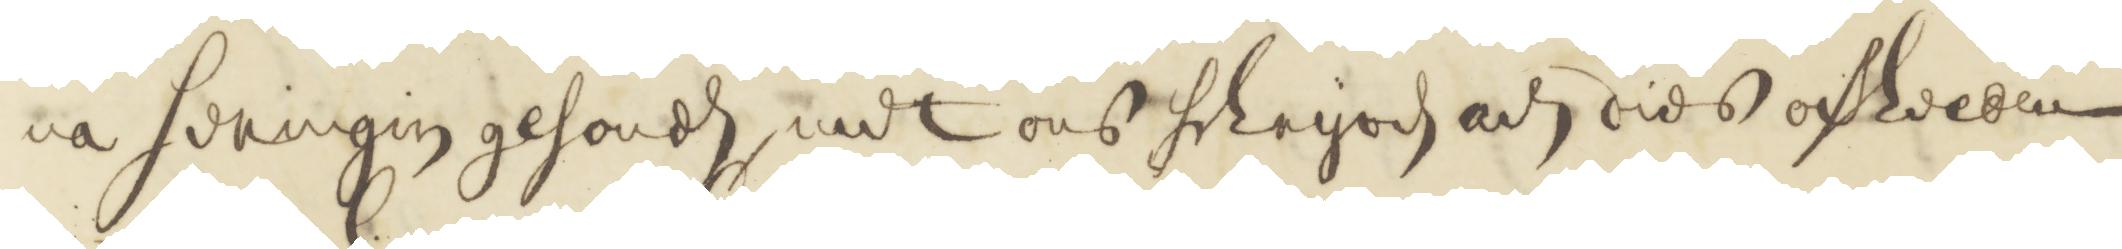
na seringin gesonden, met ons schrijven aen dies overheeden
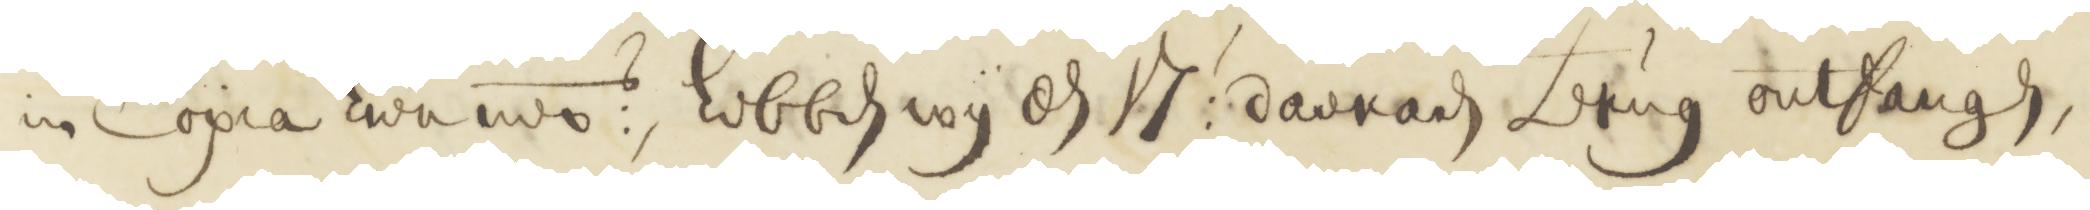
in Copia hier nev:s, hebben wij den 17:' daeraen terug ontfangen,
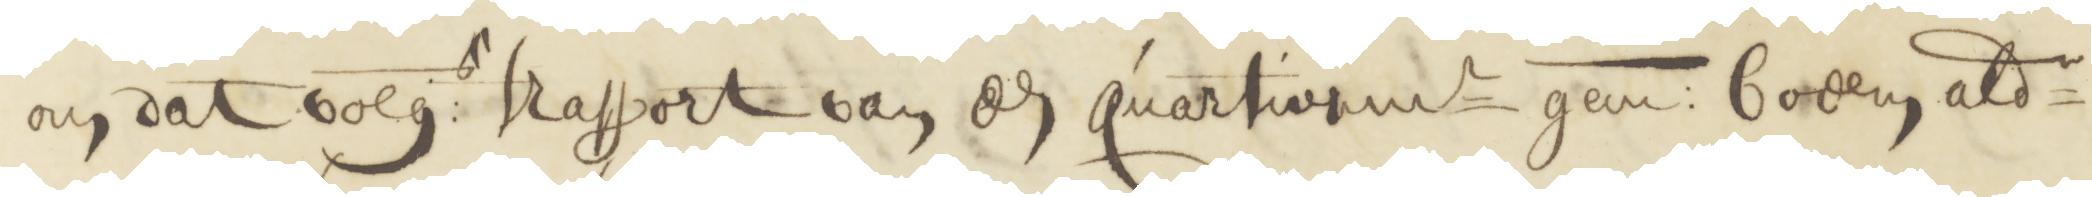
om dat volg:s trapport van den quartierm=r gem: bodem ald=r
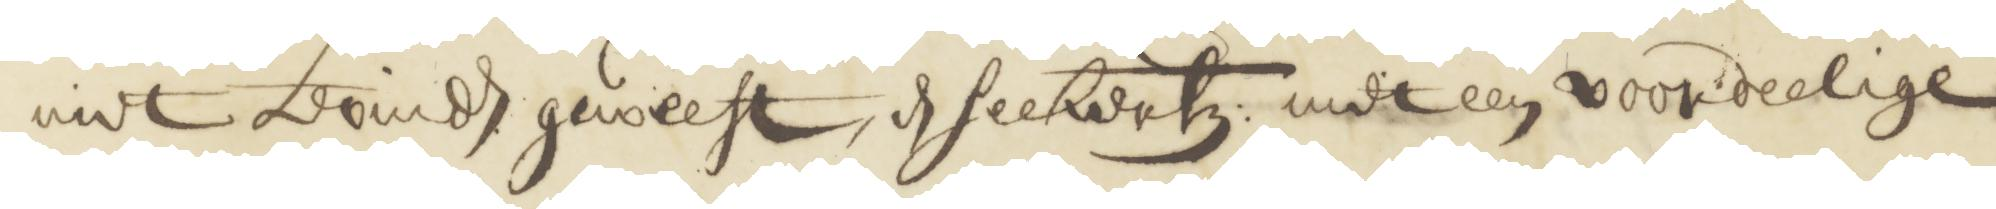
niet tevinden geweest, en seekerlijk met een voordeelige
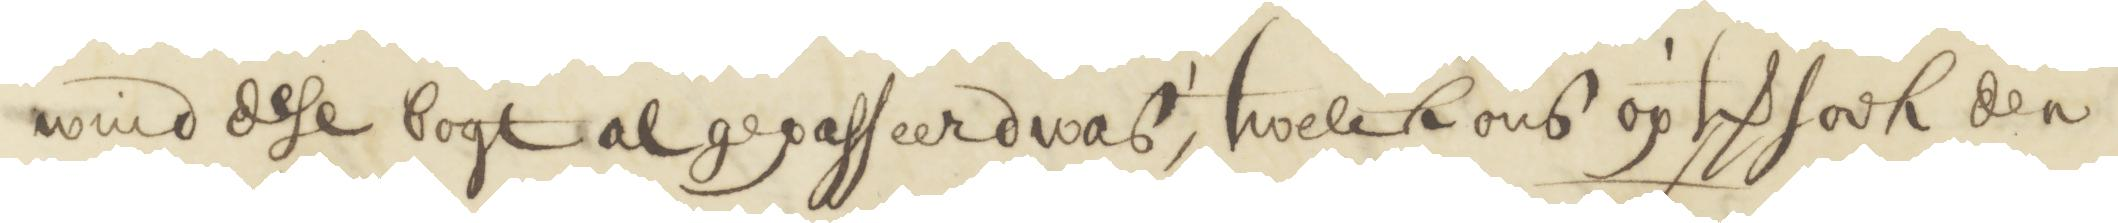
wind dese bogt al gepasseerd was, ’twelck ons op ’tversoek den
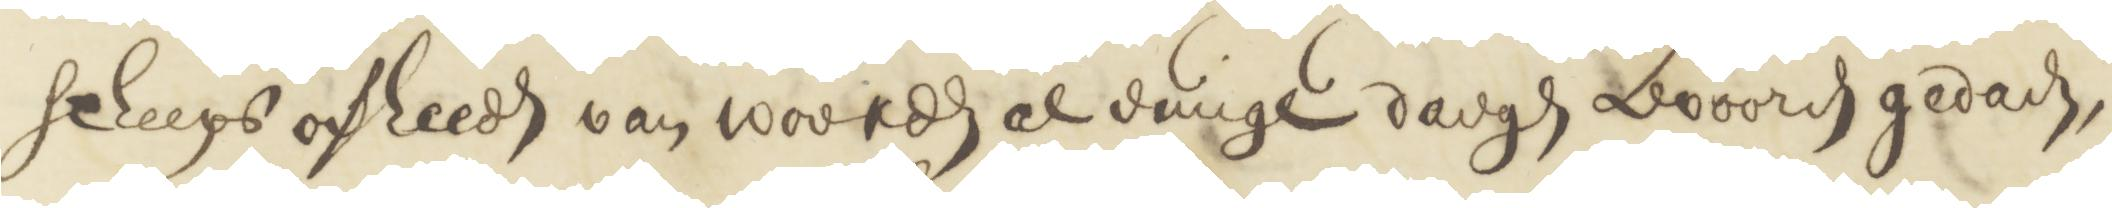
scheeps overheeden van woerden al eenige daegen tevooren gedaen,
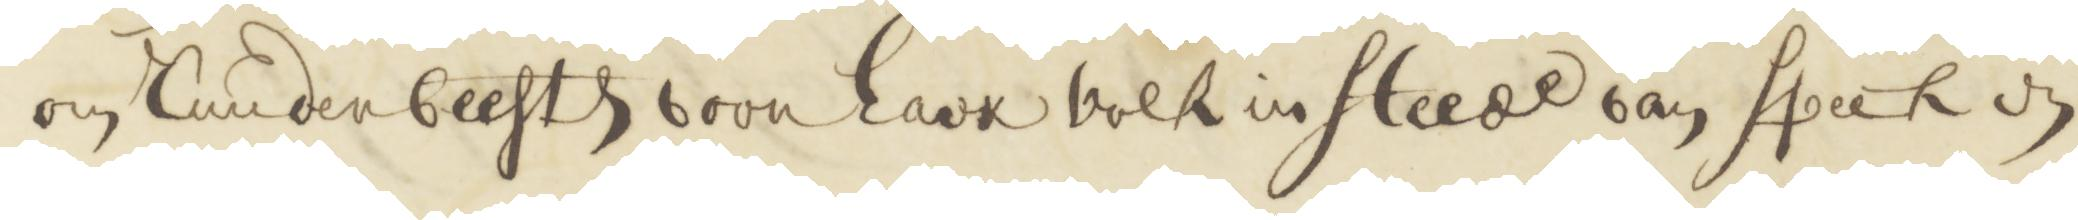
om runderbeesten voor haer volk in steede van speck en
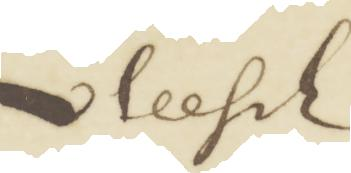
vleesch
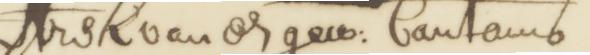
vertrek van den gew: bantams
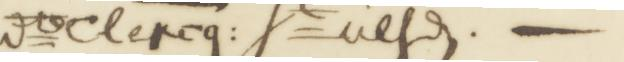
e=te clercq: J=t ulsen. —
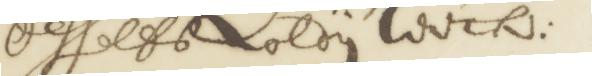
desselfs zoldij reeck:
